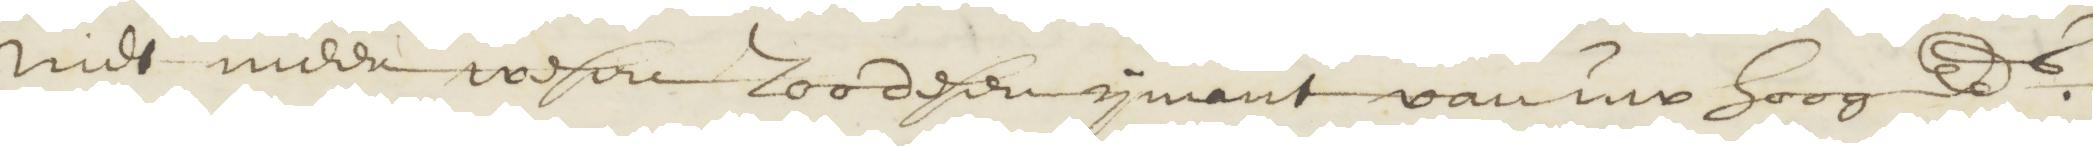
niet meer wesen Zoo desen ijmant van uw Hoog Ed:s
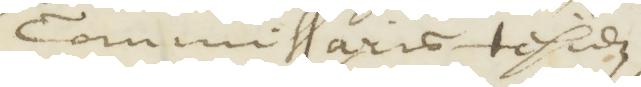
commissaris tesien
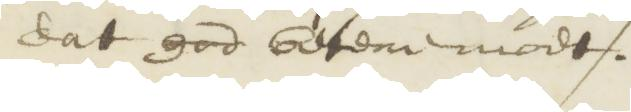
dat god betere moet.
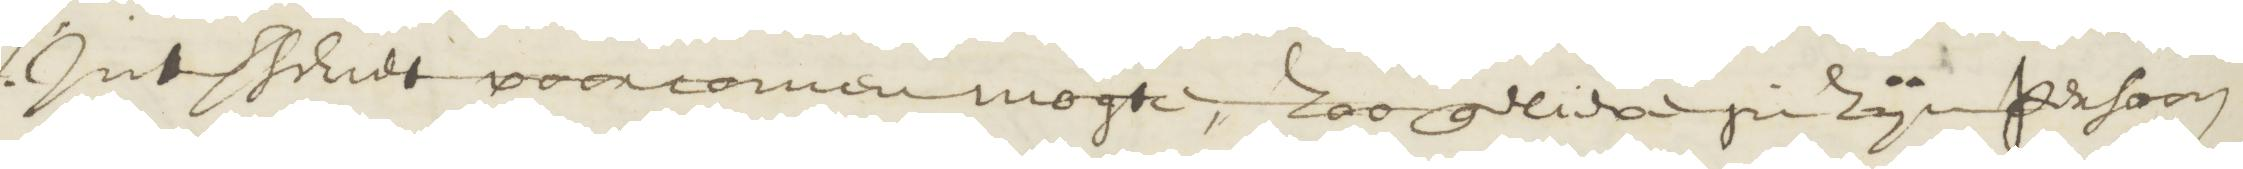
Jnt verschiet voorcomen mogte, Zoo gelieve jn Zijn persoon
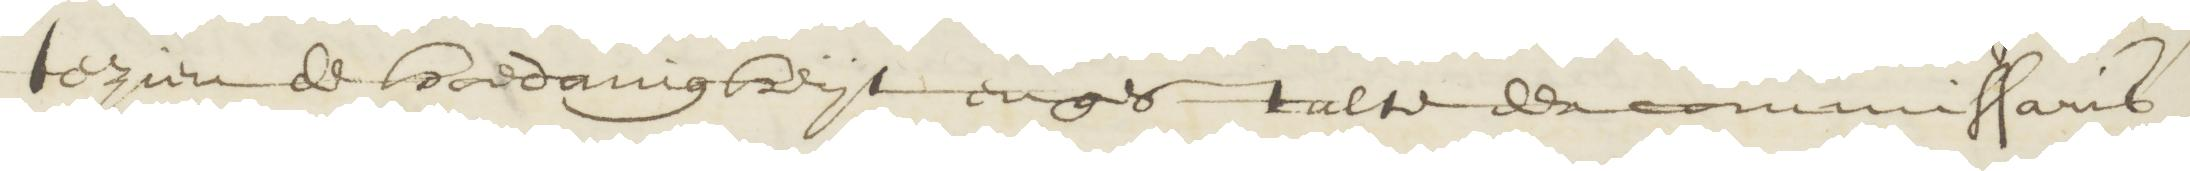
tezien de hoedanigheijt en gestalte der commissaris
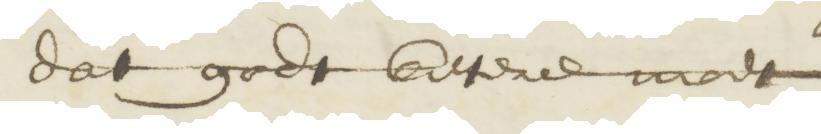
dat godt betere moet
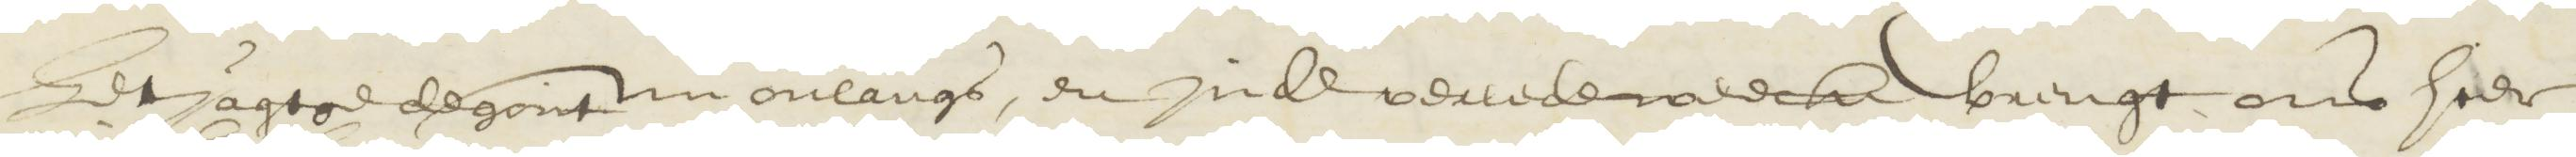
Het jagtge de gout nu onlangs, en jnde verlede weecke brengt ons hier
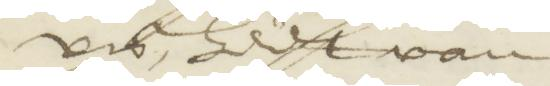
vis, heeft van
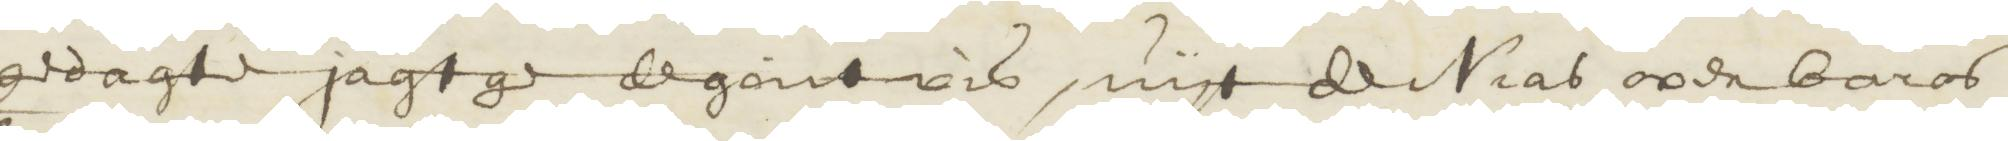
gedagte jagtge de goutvis, uijt de Nias over baros
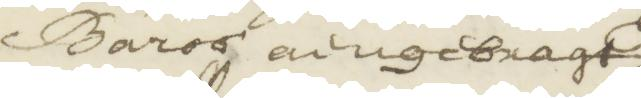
Baros aengebragt
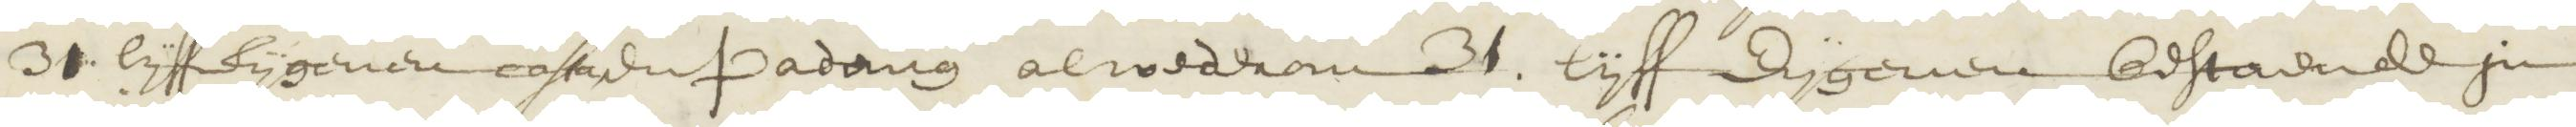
31 lijffeijgenen casta en padang al wederom 31. lijff Eijgenen bestaende jn
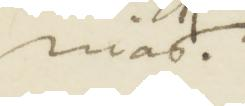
nias
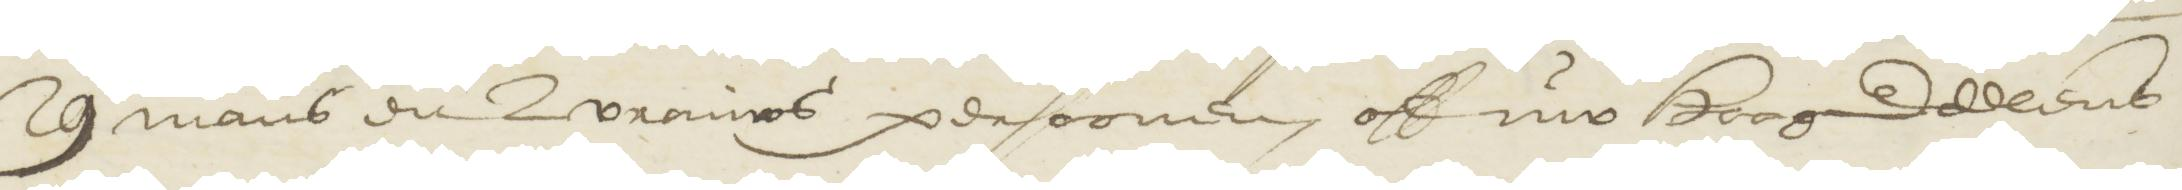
29 mans en 2 vrouws persoonen, off uw hoog Edelens
